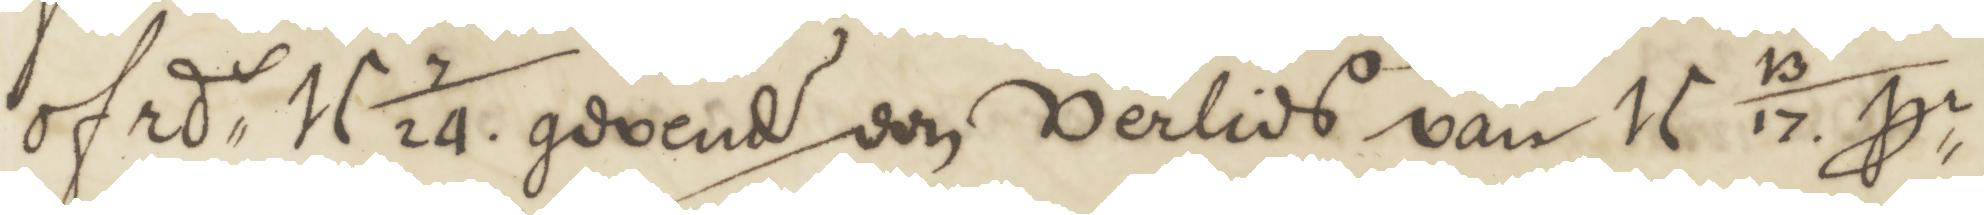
of rd„s 15 7/24. gevende een verlies van 15 13/17. p„r
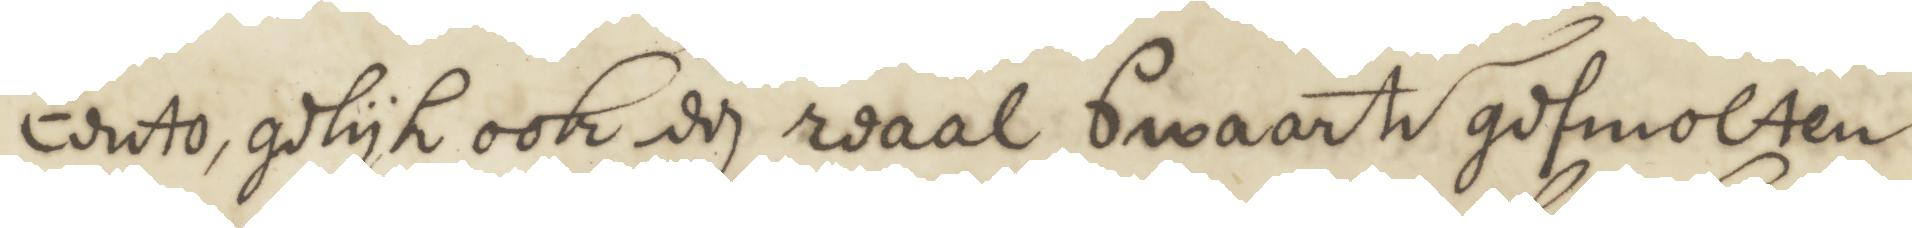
cento, gelijk ook een reaal swaarte gesmolten
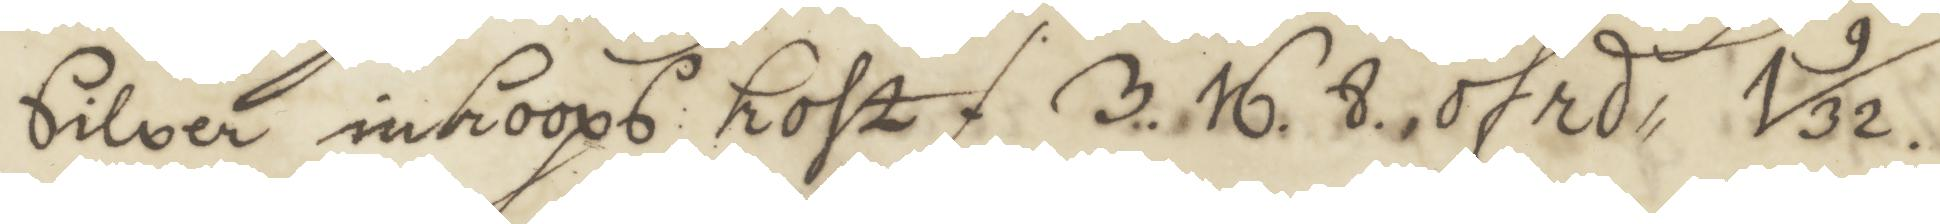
silver inkoops: kost ƒ 3. 16. 8., of rd„s 1 9/32.
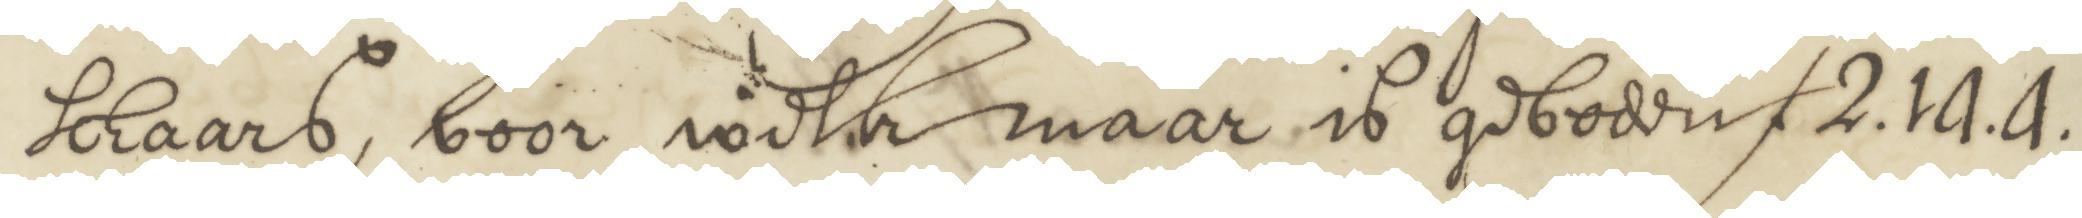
schaars, voor welk maar is geboden ƒ 2. 14. 4.
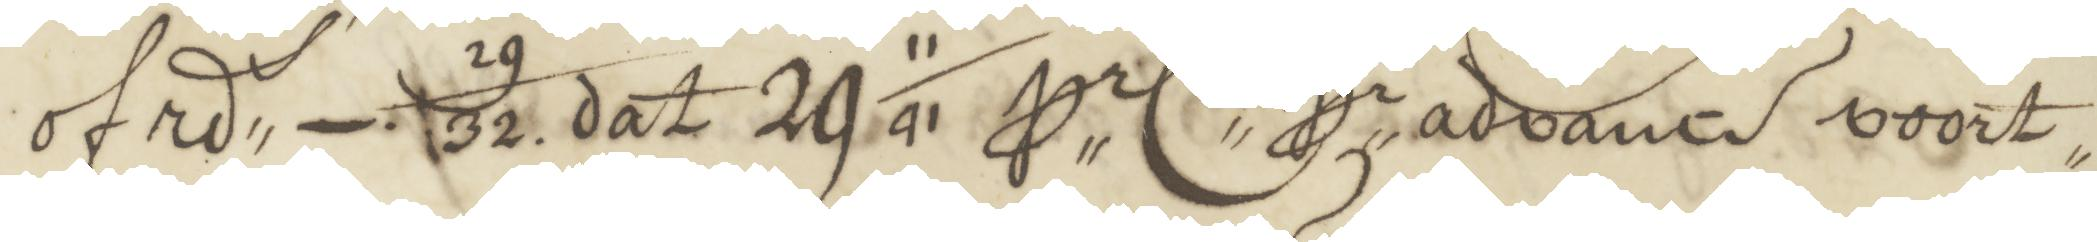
of rd„s —. 29/32. dat 29 11/41. p„r C„to p„r advance voort„
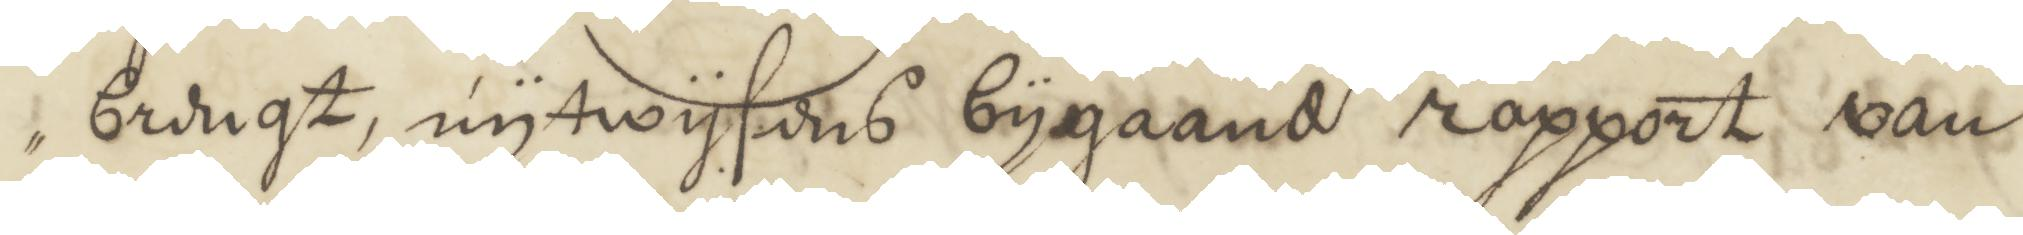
„brengt, uijtwijsens bijgaande rapport van
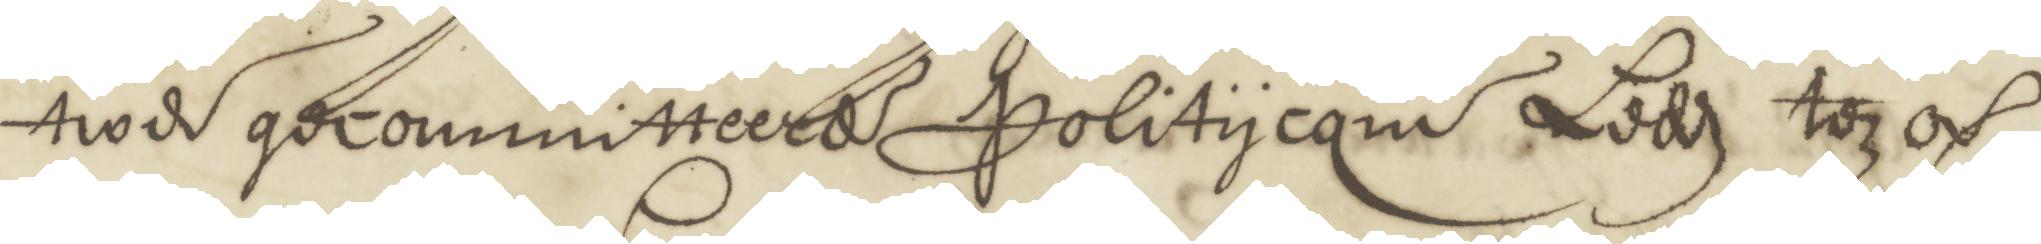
twee gecommitteerde politijcque Leden ten over
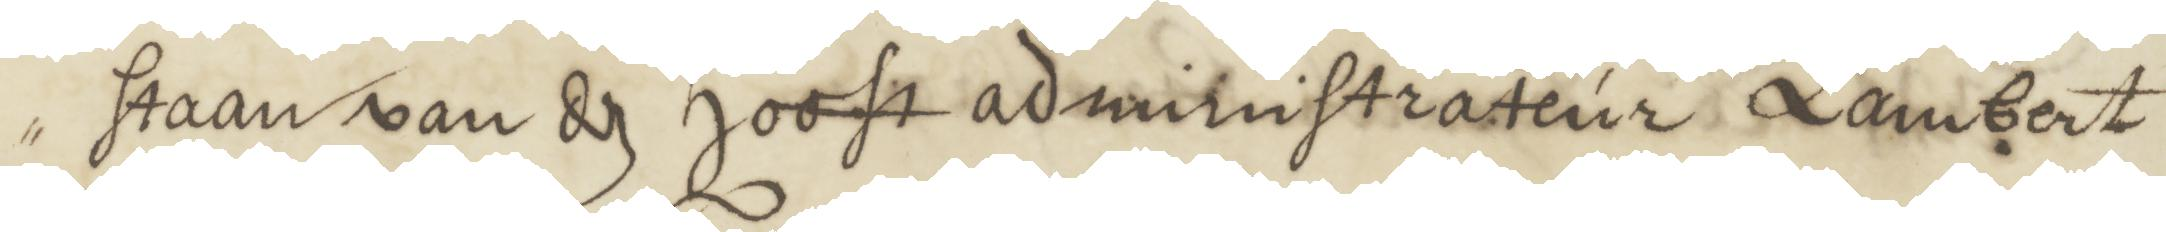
„staan van den hooft administrateur Lambert
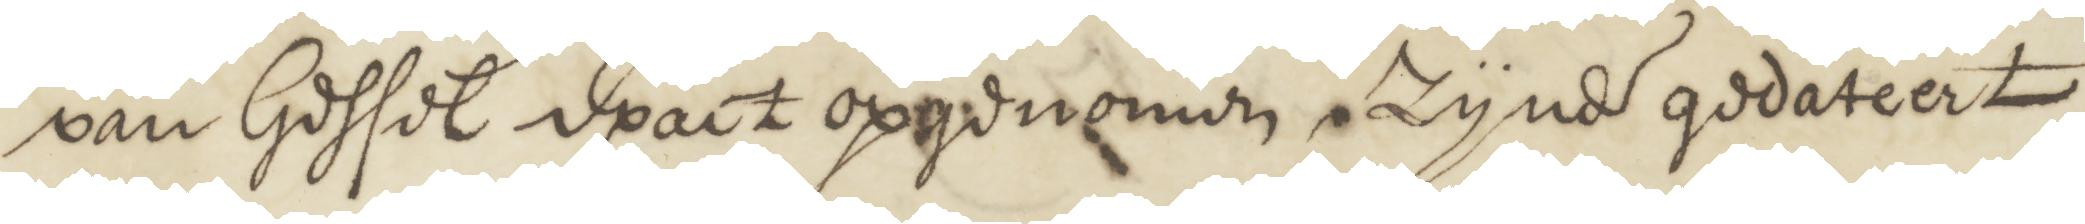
van Gessel exact opgenomen, zijnde gedateert
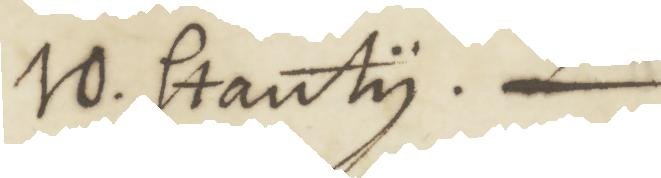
10. stantij. —
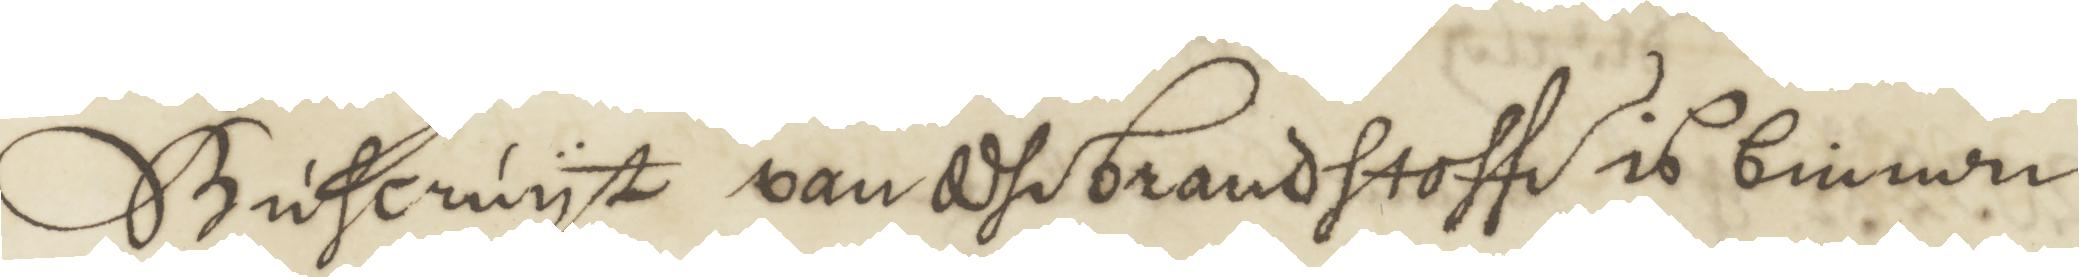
Buscruijt van dese brandstoffe is binnen
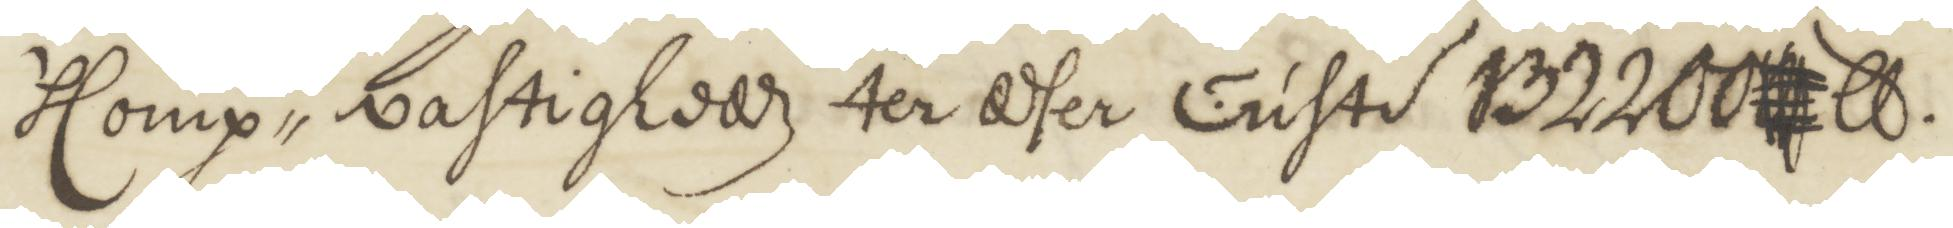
'sComp„s vastigheden ter deser Custe 1322000 lb.
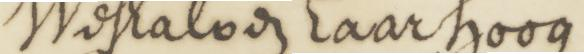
Weshalven haar hoog
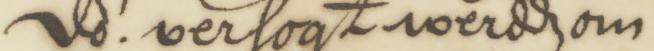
Ed.' versogt werden om
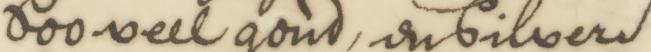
soo veel goud, en silvere
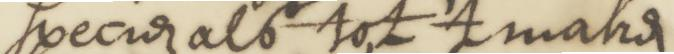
specien als tot ’t maken
